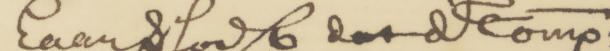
haar versoek dat d'Ecomp:
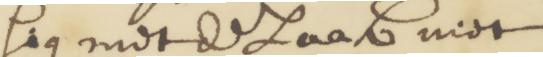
sig met dezaak niet
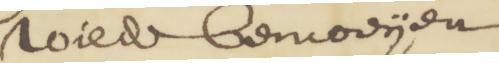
wilde bemoeijen
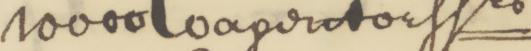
10000 wapentorss=rs
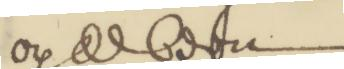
op de been
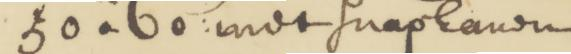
50 â 60: met snaphanen
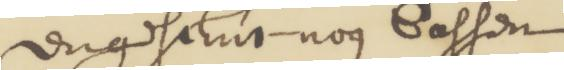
engeschut nog bassen
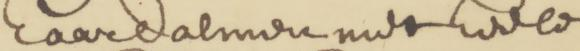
haar dalmen met heele
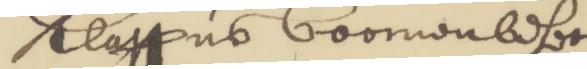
klappus boomen beset
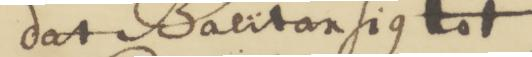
dat Balitar sig tot
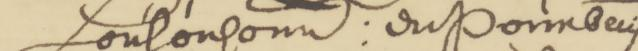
sousouhoun: en pourbaij
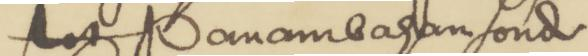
tot Panambahan soude
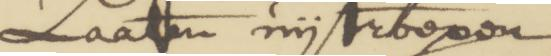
laaten uijtroepen
